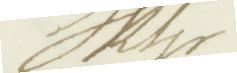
IKSjr
